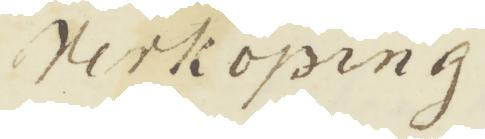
verkoping
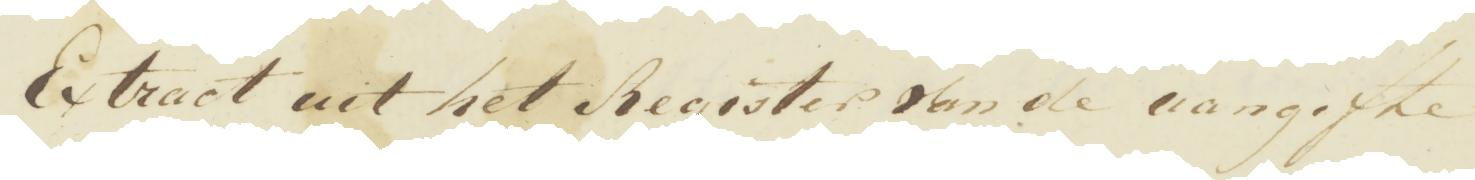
Extract uit het Register van de aangifte
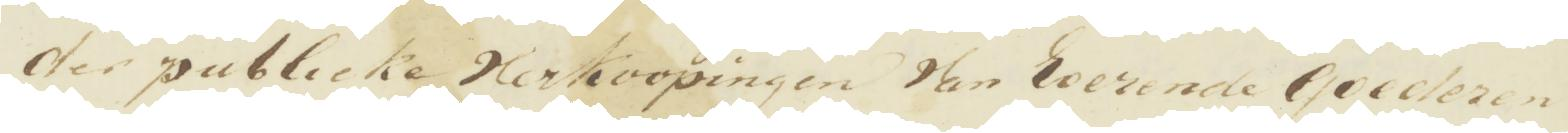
der publieke Verkoopingen van roerende Goederen
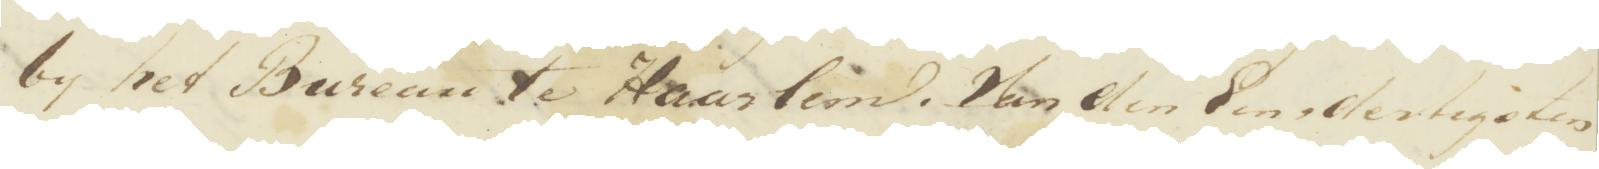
by het Bureau te Haarlem, van den Een en dertigsten
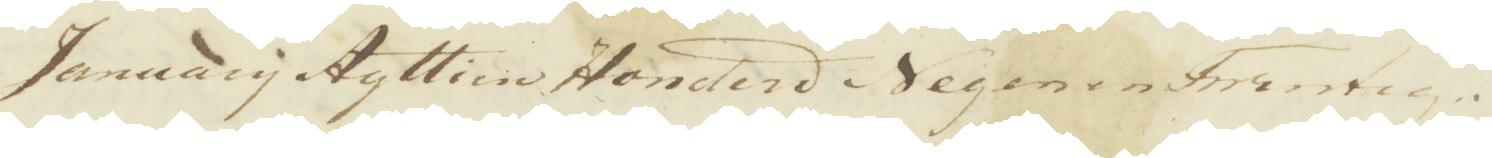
Januarij Agttien Honderd Negen en twintig.
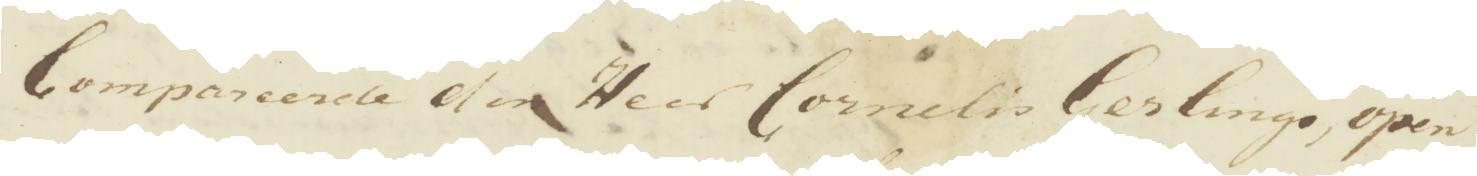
Compareerde den Heer Cornelis Gerlings, open
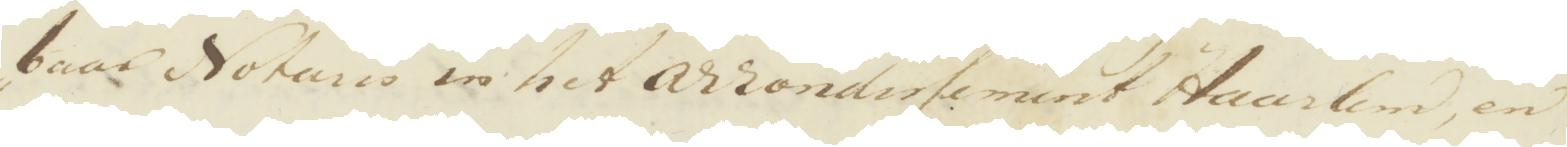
baar Notaris in het arrondissement Haarlem, en
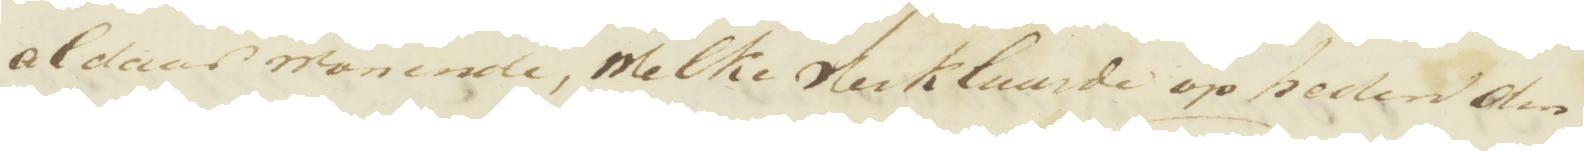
aldaar wonende, welke verklaarde op heden den
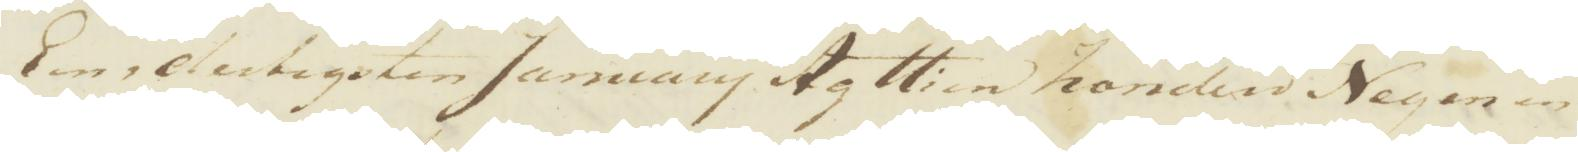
Een en dertigsten January Agttien Honderd Negen en
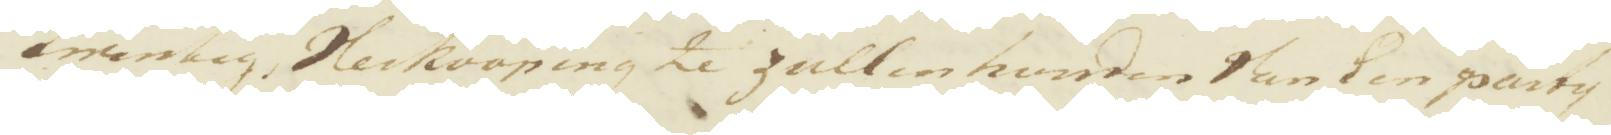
twintig, Verkooping te zullen houden Van Een party
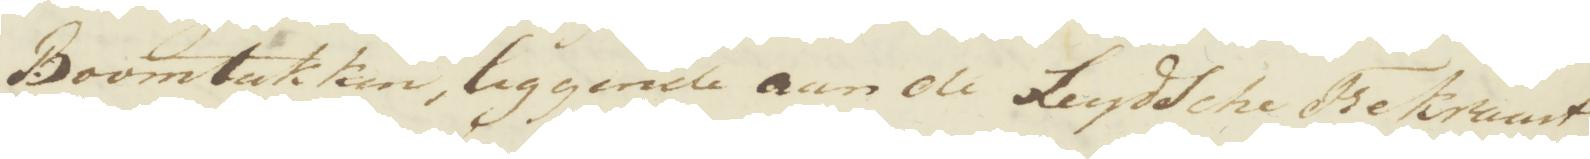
Boomtakken, liggende aan de Leydsche Trekvaart
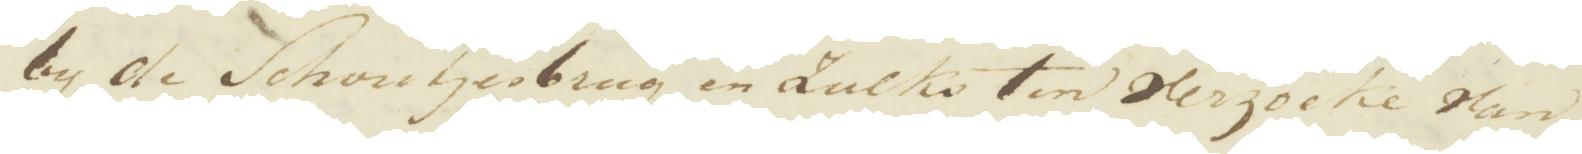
by de Schoutjesbrug en zulks ten verzoeke van
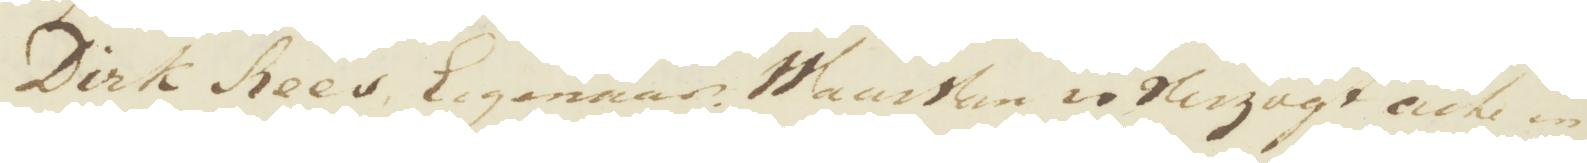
Dirk Hees, Eigenaar Waarvan is verzogt acte en
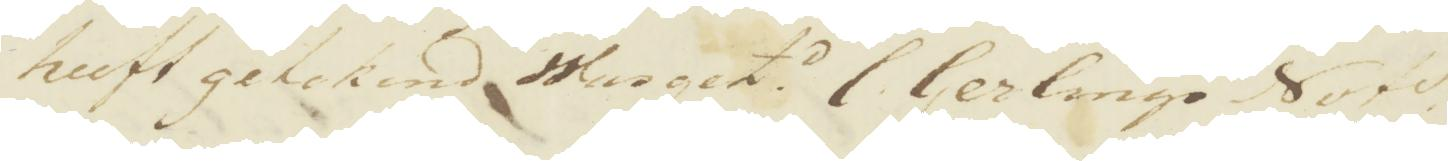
heeft getekend Was get.d C: Gerlings Not.s
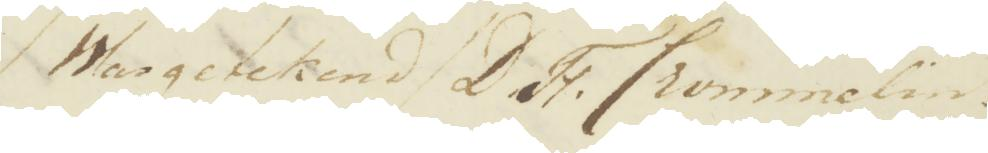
/Was getekend/ D.F.Crommelin.
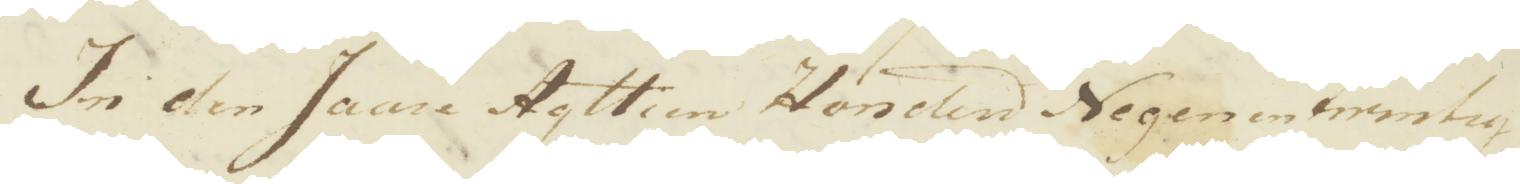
In den Jaare Agttien Honderd Negen en twintig
